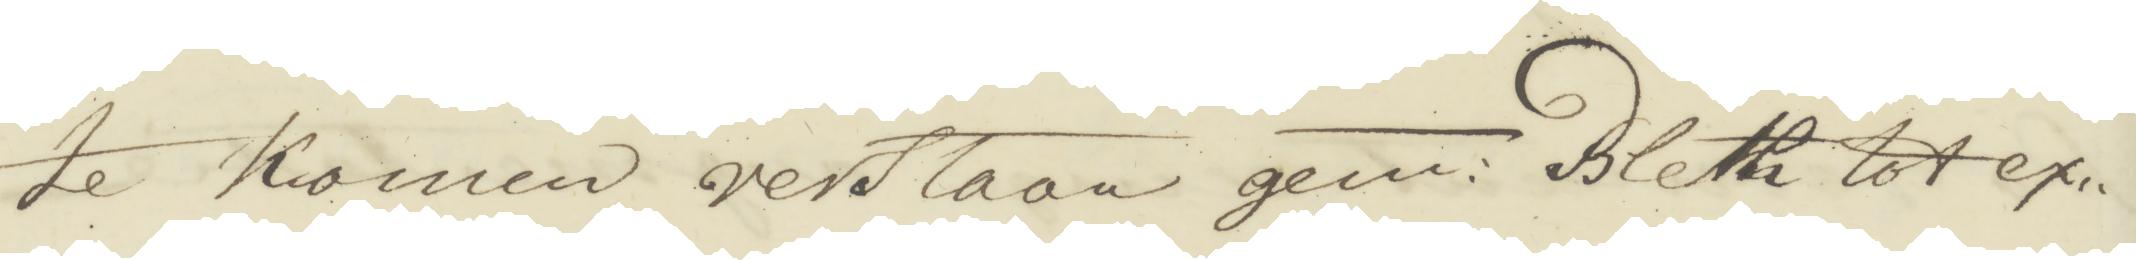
te komen verstaan gem: Bleth tot ex„
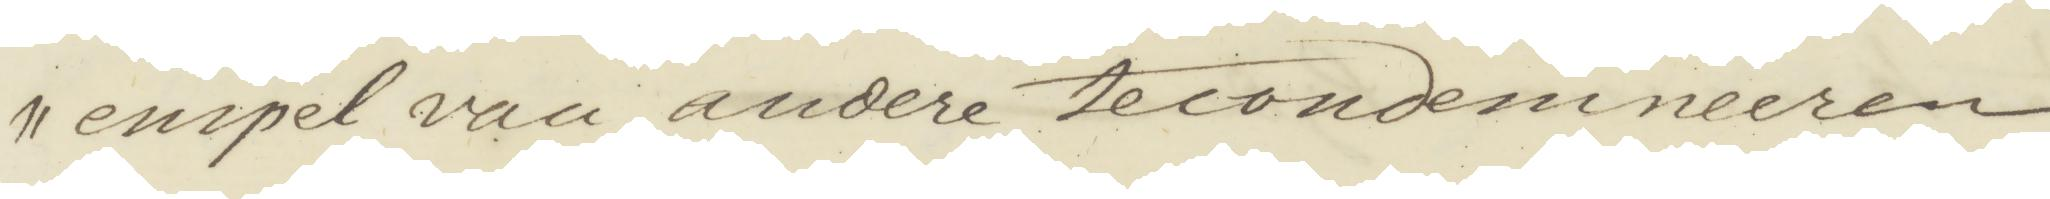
„ empel van andere tecondemneeren
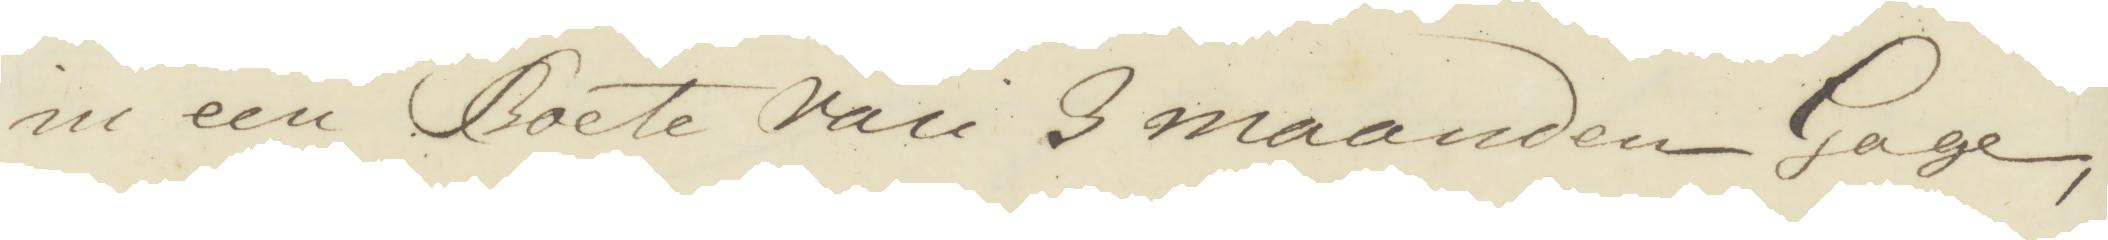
in een Boete van 3 maanden Gage,
